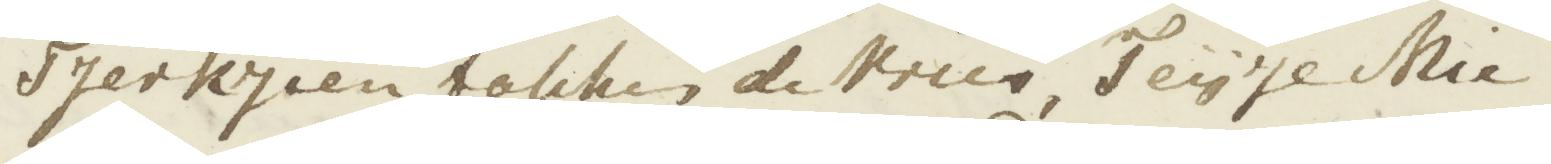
Tjerkjien fokkes de Vries, Teijje Mie
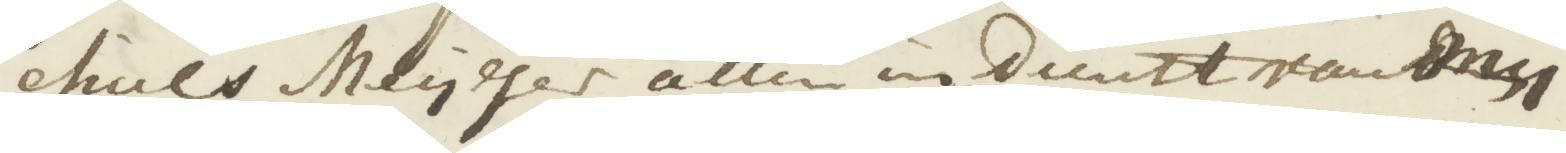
chiels Meijjer allen in dienst van mij
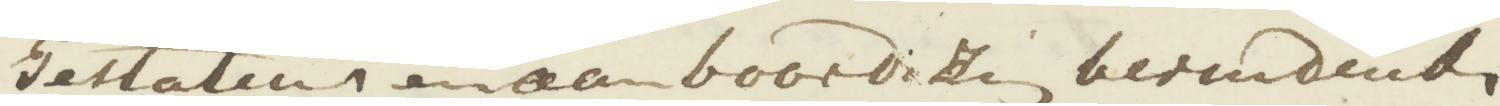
Testateur en aan boord Zich bevindend,
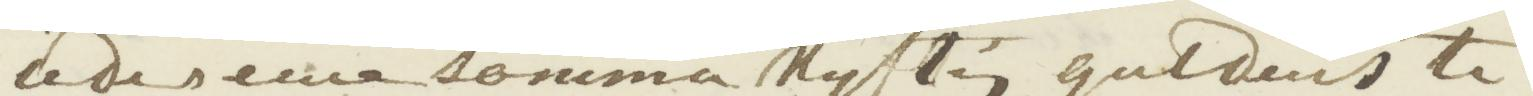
ieder eene Somma Vyftig guldens te
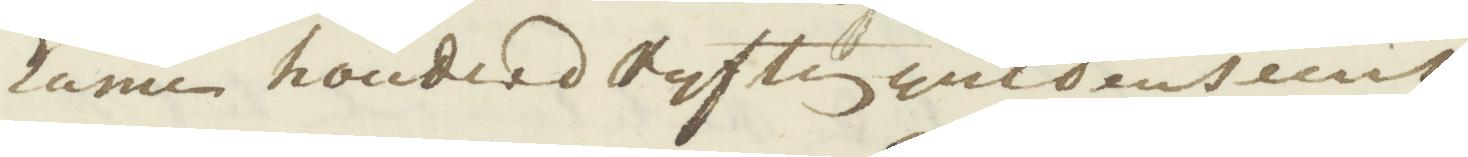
Zamen honderd Vyftig guldens eens
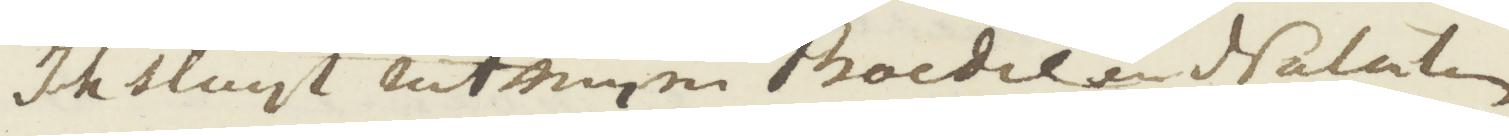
Ik sluyt uit myne Boedel en Nalaten
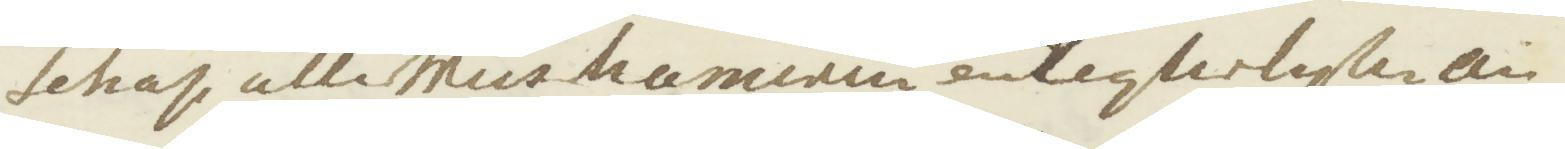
schap alle Weeskameren en Regterlyke au
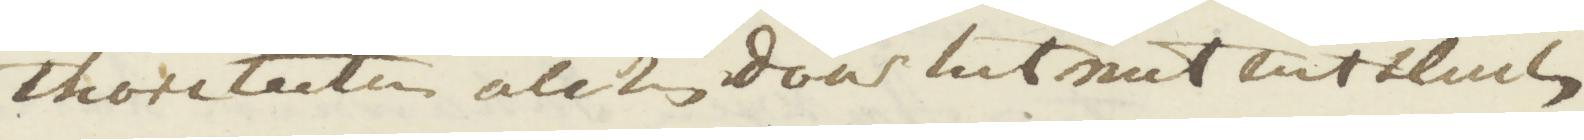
thoriteiten als Zij door het niet uitsluiten
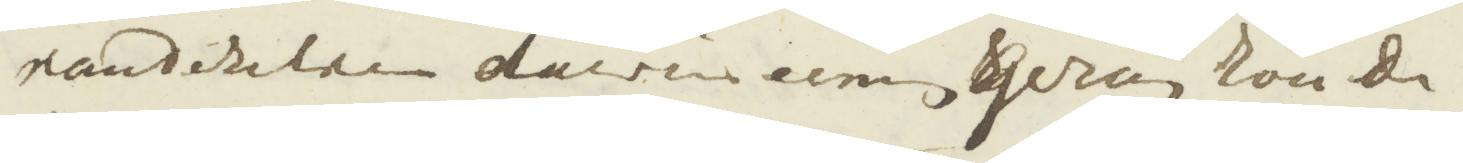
van dezelven daarin eenig Gezag Zoude
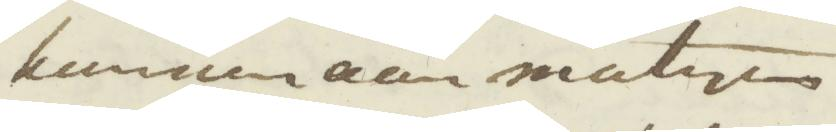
kunnen aanmatigen
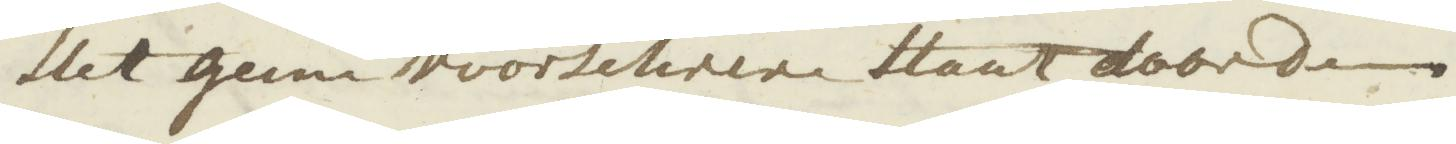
Het geene voorschreven Staat door den
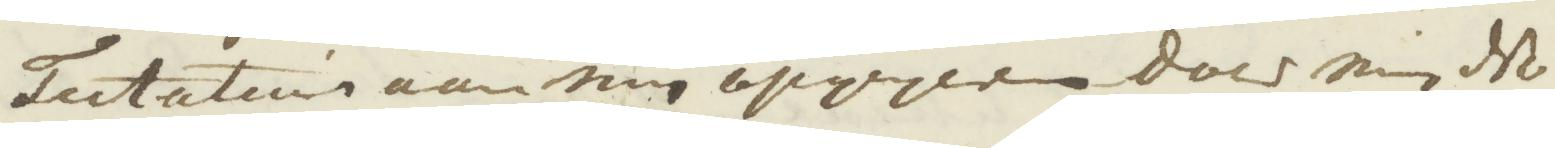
Testateur aan mij opgegeven door mij No
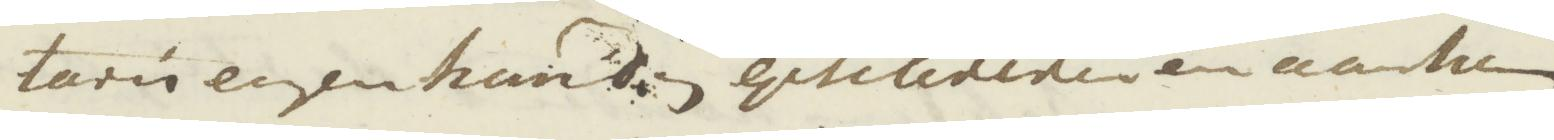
taris eigenhandig geschreven en aan hem
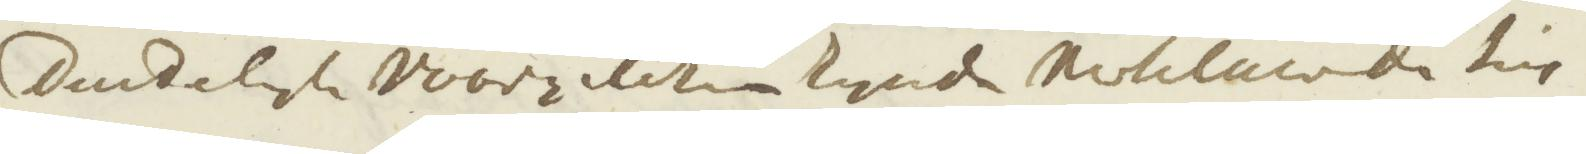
Duidelyk Voorgelezen Zynde Verklaarde hij
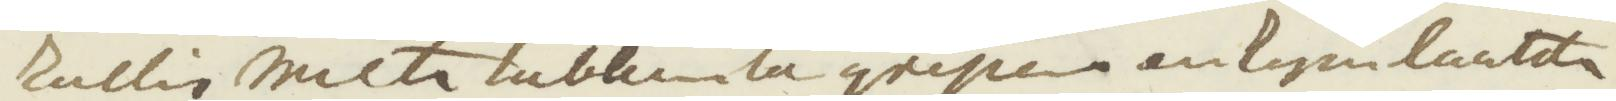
Zulks wel te hebben begrepen en Zyne laatste
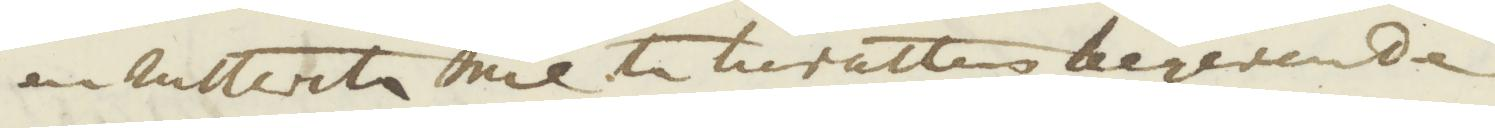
en Uitterste wil te bevatten begerende
